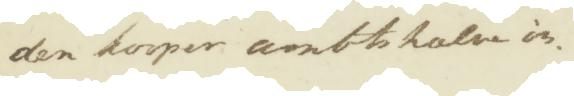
den kooper ambtshalve in
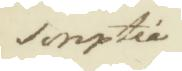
scriptie
